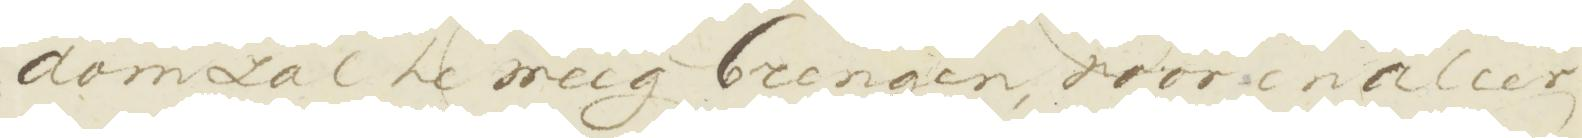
„dom zal te weeg brengen, voor en aleer,
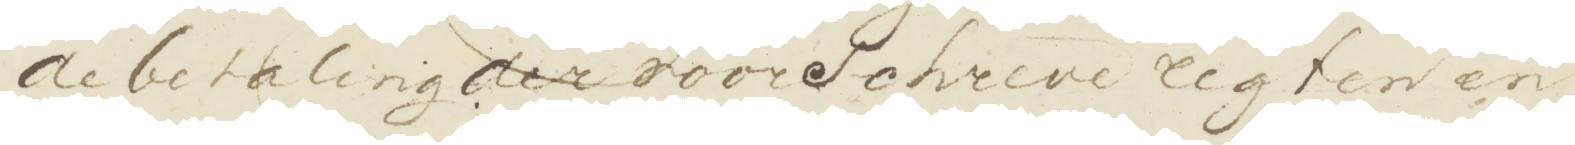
de betaling der voorschreve regten en
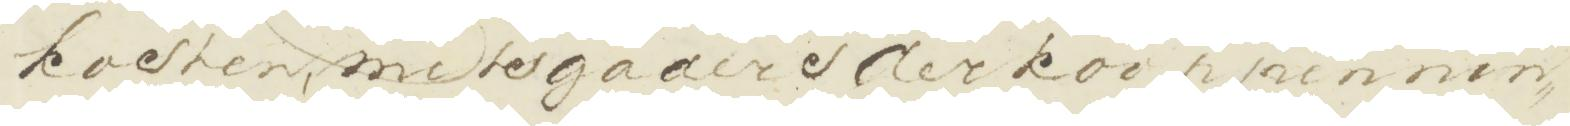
kosten, mitsgaders der kooppennin„
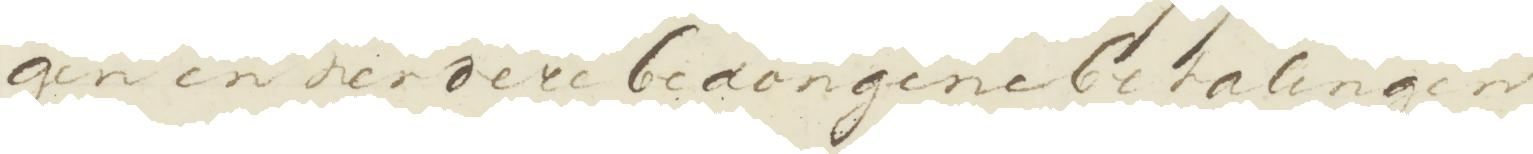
gen en verdere bedongene betalingen
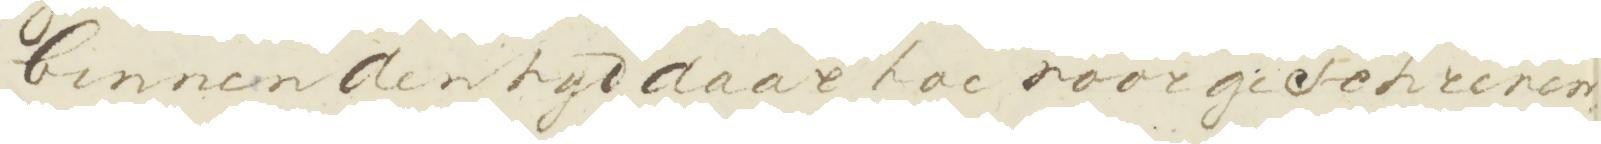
binnen den tyd daar toe voorgeschreven
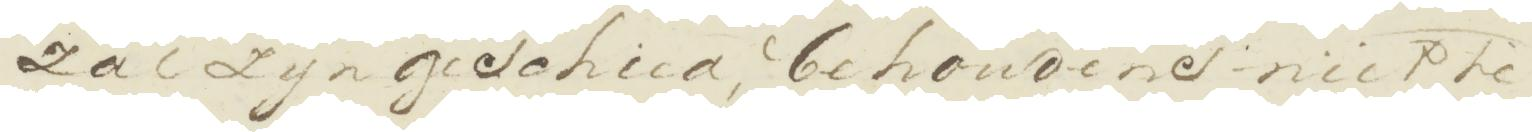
zal zyn geschied, behoudens niet te
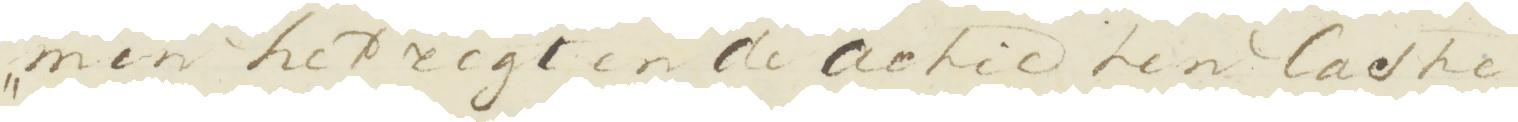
„min het regt en de actie ten laste
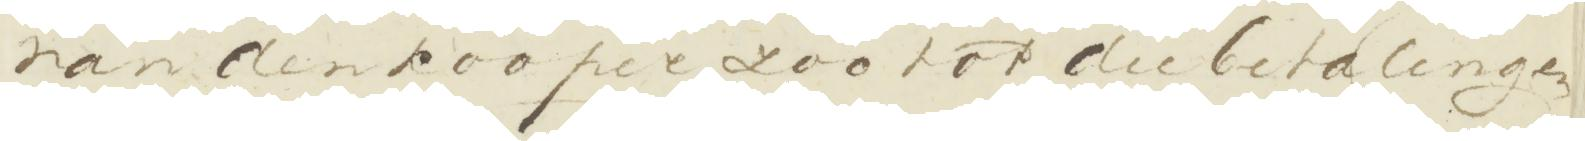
van den kooper zoo tot die betalingen
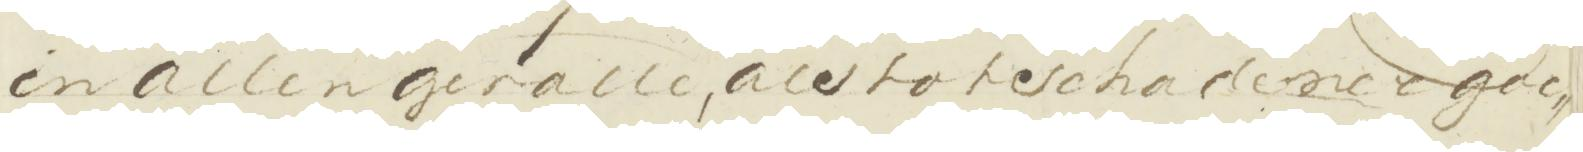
in allen gevalle, als tot schadevergoe„
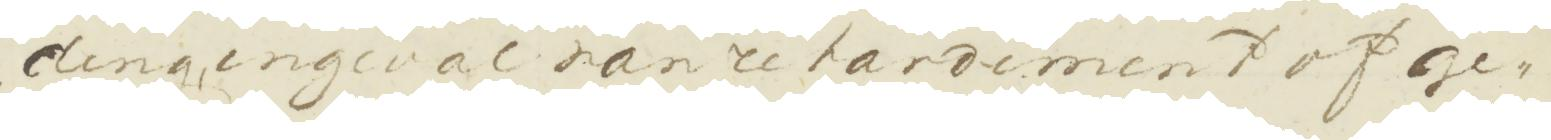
„ding, ingeval van retardement of ge„
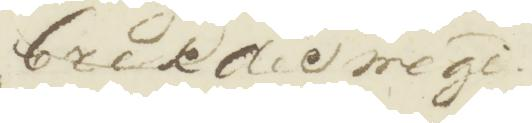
brek des wege.
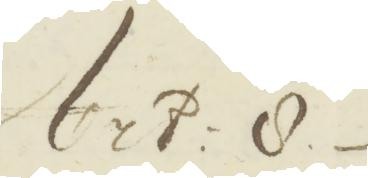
Art: 8.
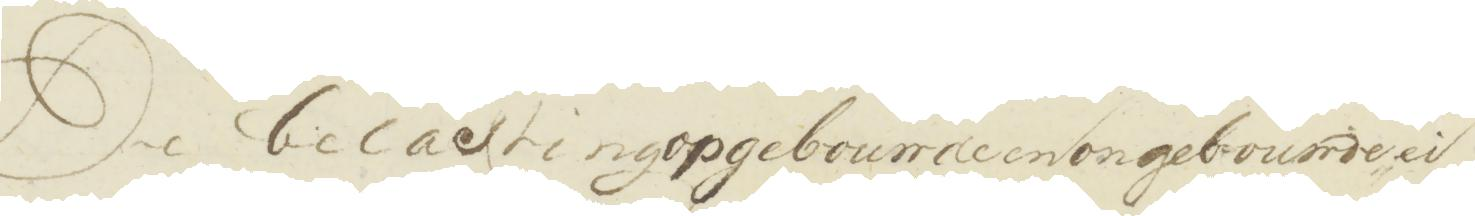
De belasting op gebouwde en ongebouwde ei
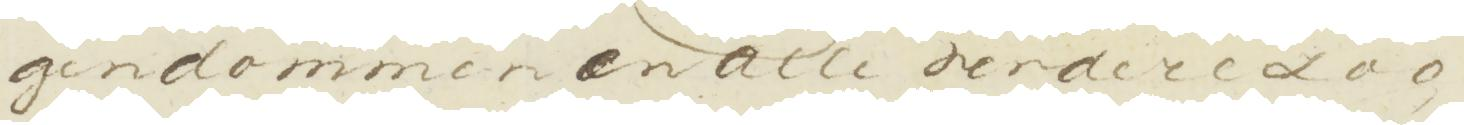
gendommen en alle verdere zoo
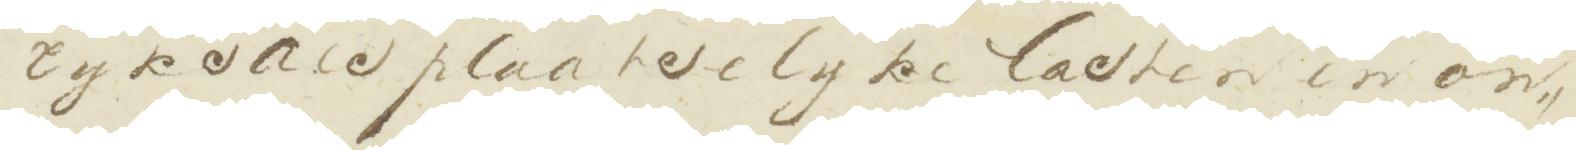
ryks als plaatselyke lasten en on„
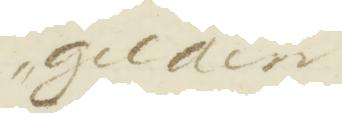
„gelden
